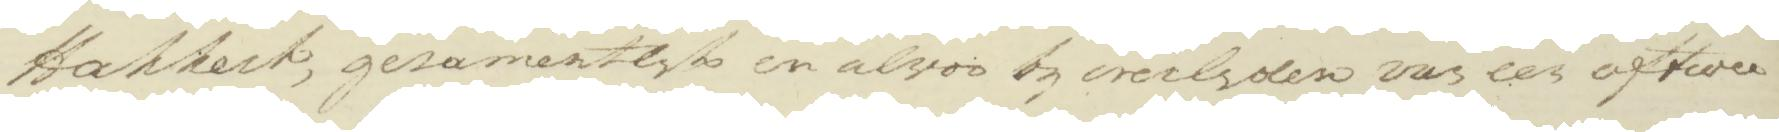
Hakkert, gesamentlyk en alzoo by overlyden van een of twee
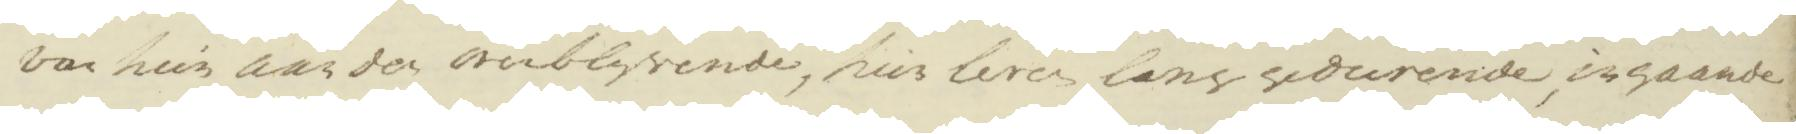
van hun aan den overblyvende, hun leven lang gedurende, ingaande
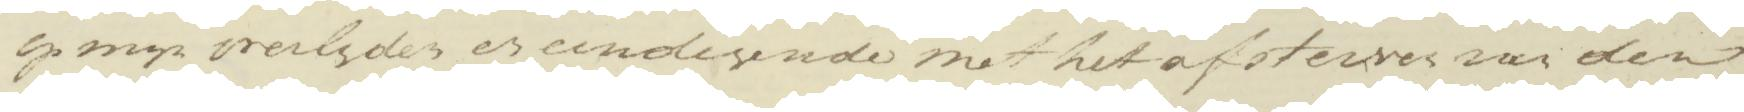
op myn overlyden en eindigende met het afsterven van den
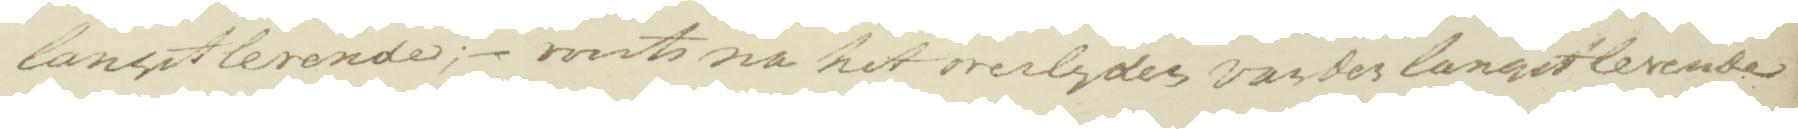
langstlevende; - voorts na het overlyden van den langstlevende
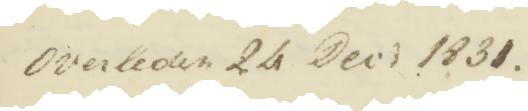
Overleden 24 Dec:o 1831.
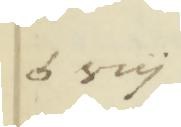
¶vrij
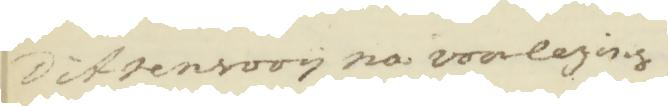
Dit renvooij na voorlezing
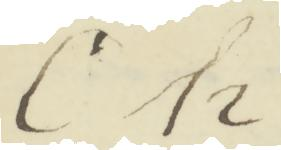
C h
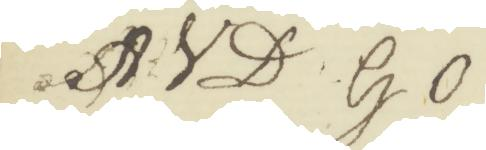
A: V D: G O
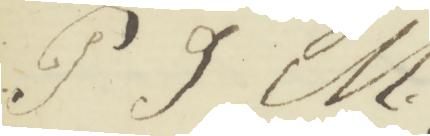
P J M.
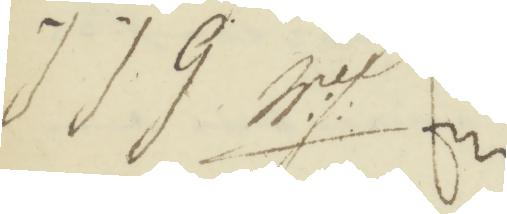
J J:G W:tS: Cr
